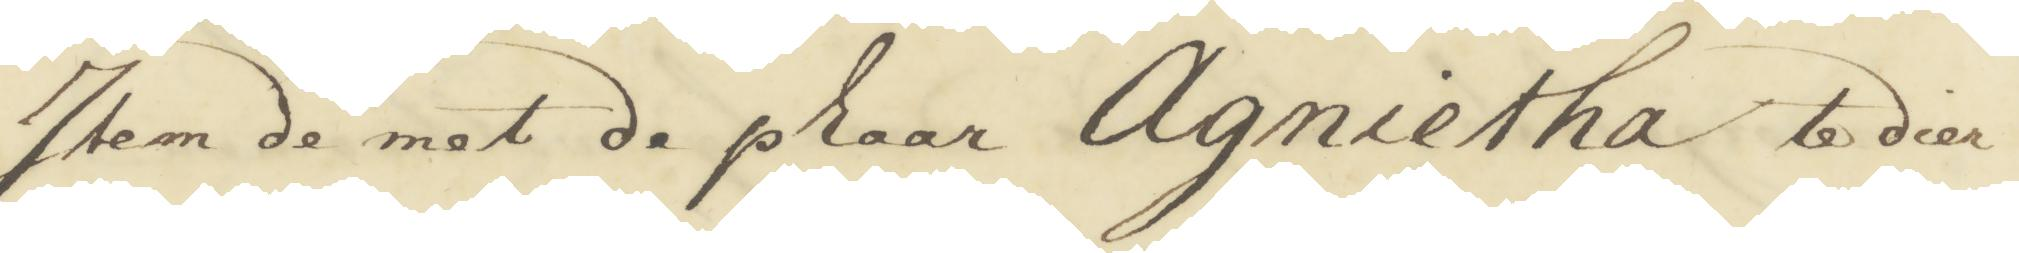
Jtem de met de phaar Agnietha te dier
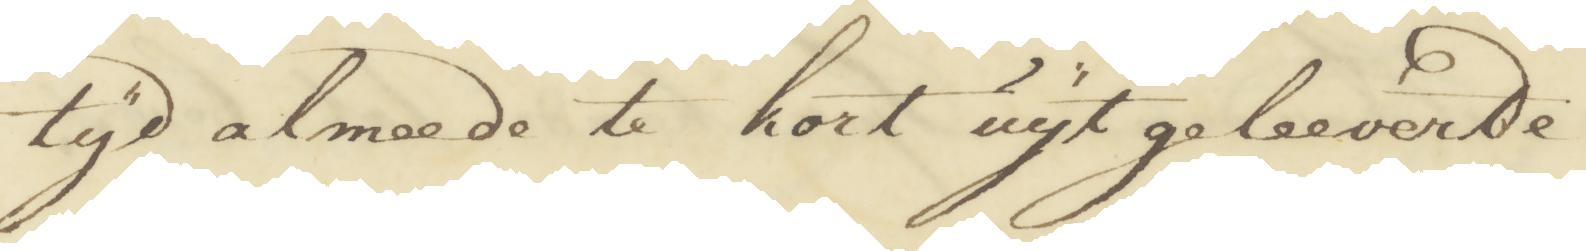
tijd almeede te kort uijt geleeverde
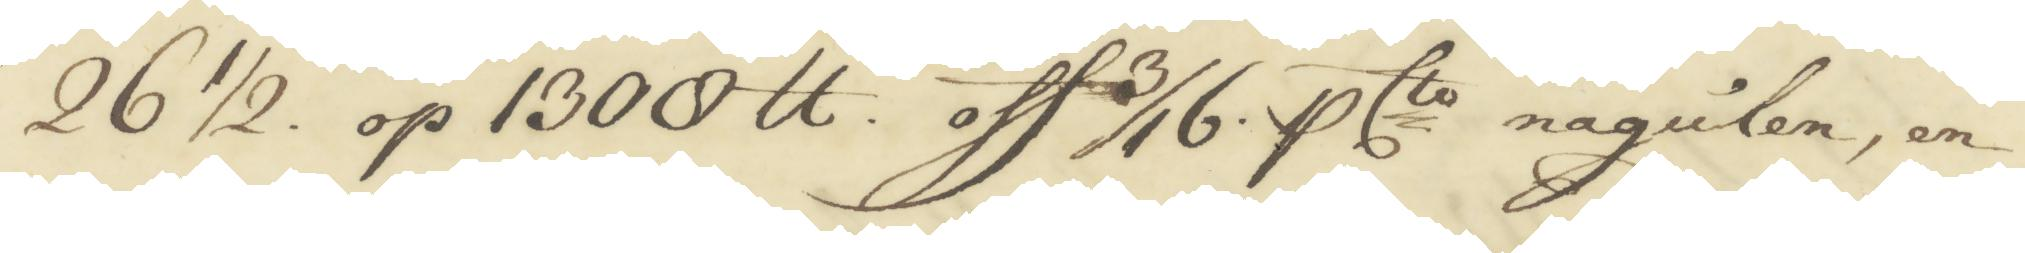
26½. op 1308 lb: off 3/16. pC=to nagulen, en
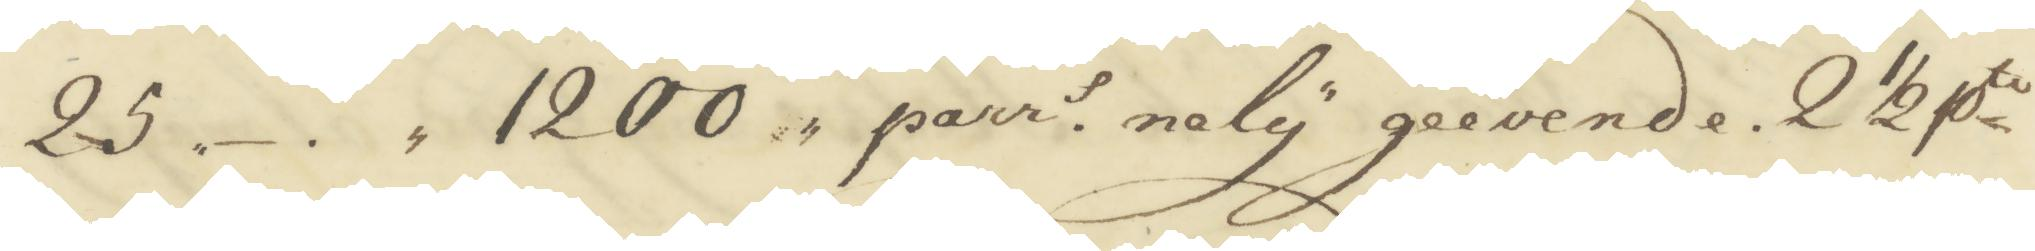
25 „ — . „ 1200 „ parr.s nelij geevende. 2½ p=to
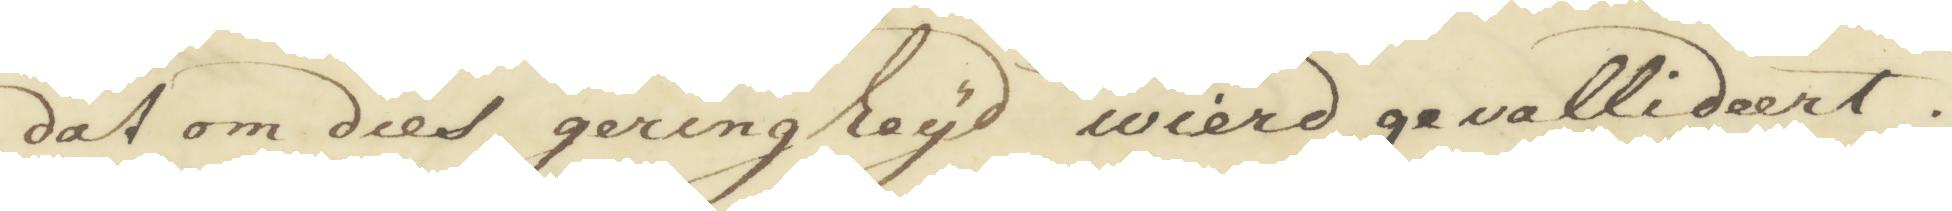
dat om dies geringheijd wierd gevallideert.
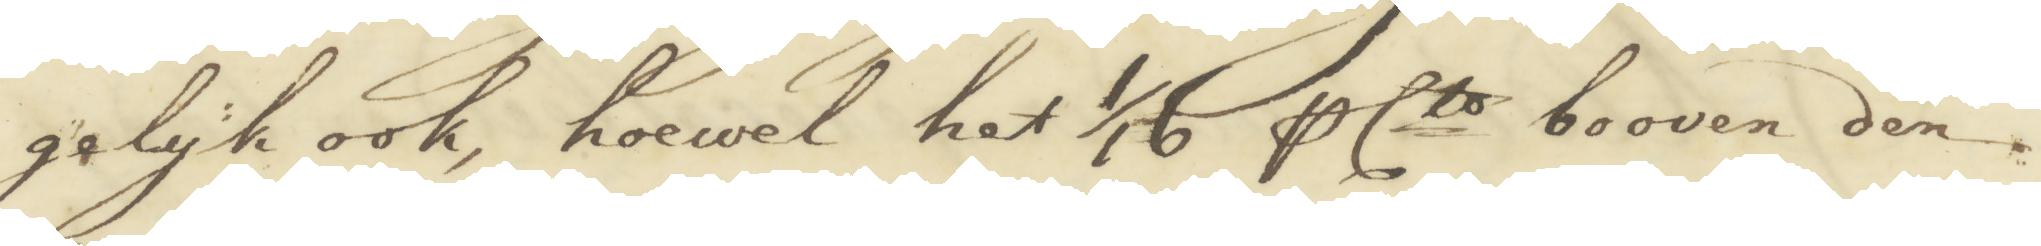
gelijk ook, hoewel het 1/16 pC=to booven den
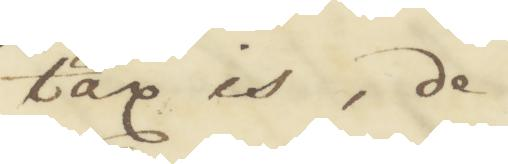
tax is, de
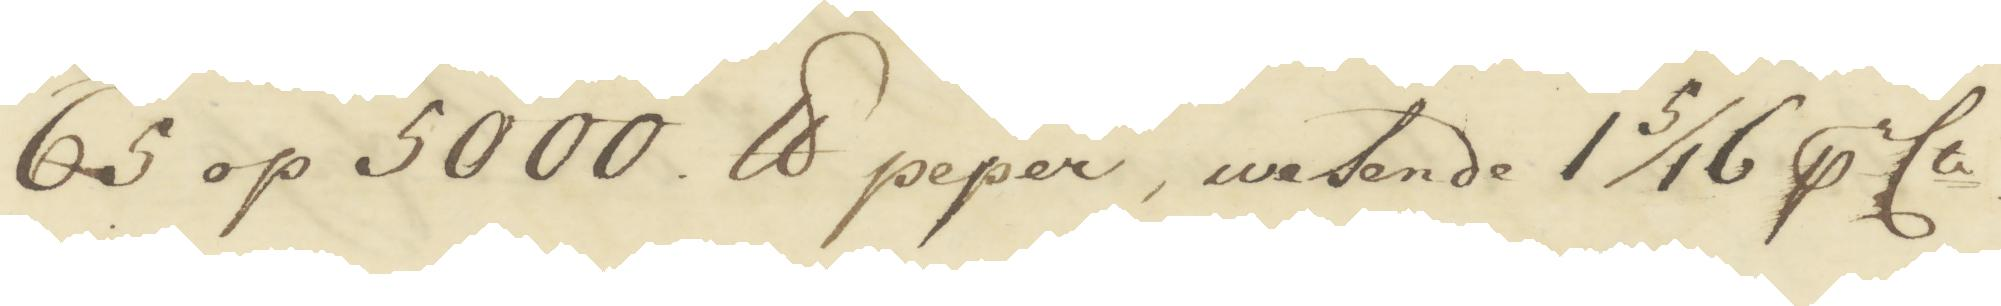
65 op 5000. lb peper, wesende 1 5/16 prC=to
